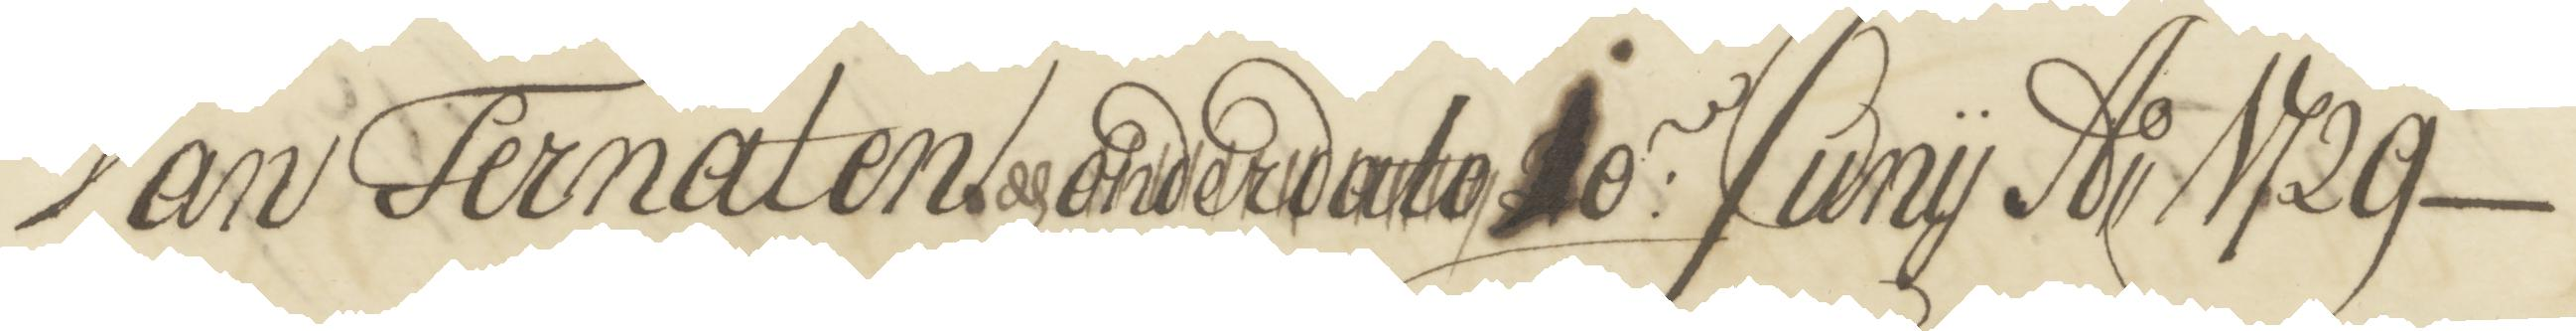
Van Ternaten. den onder dato 10:en Junij A„o 1729—
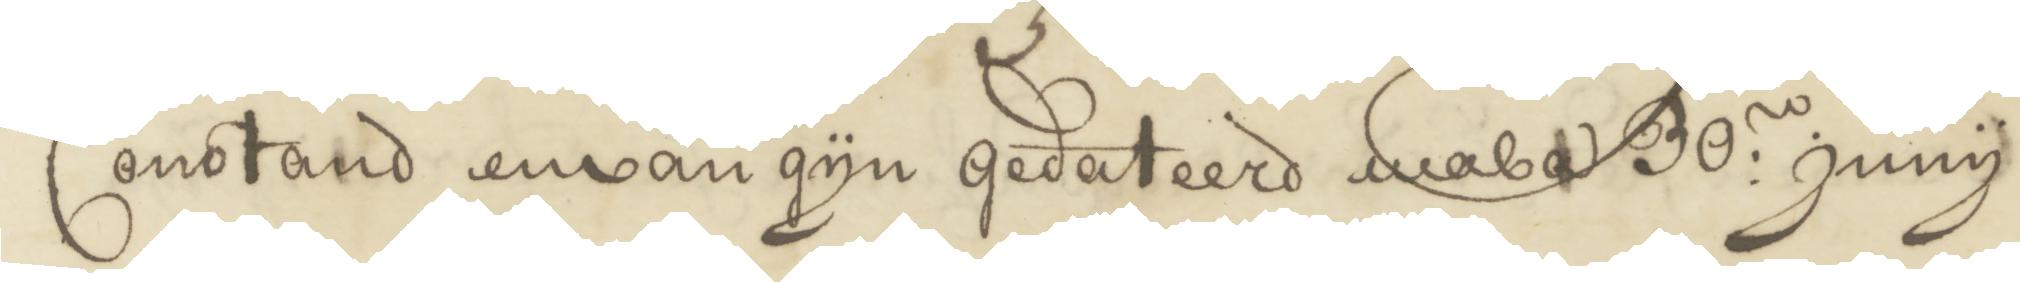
Constand envan gijn gedateerd maba 30:en junij
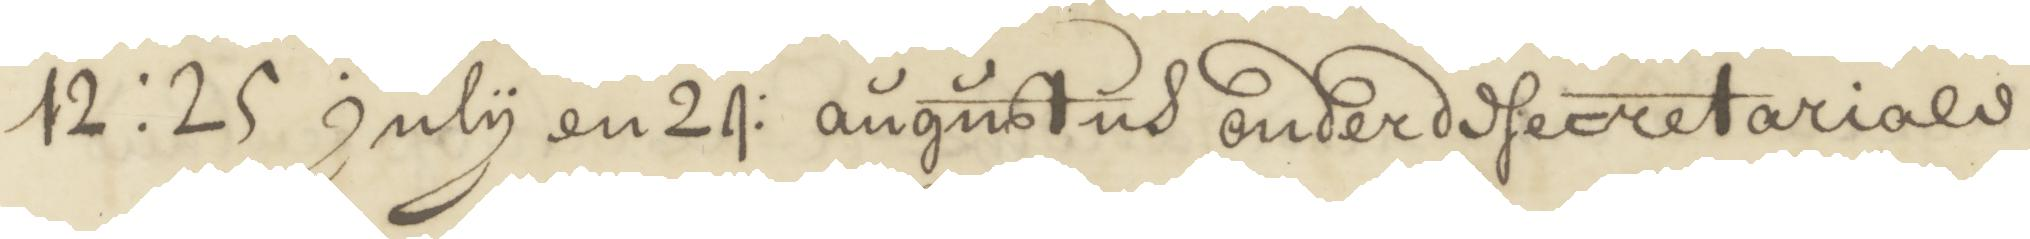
12: 25 julij en 24: augustus onder desecretariale
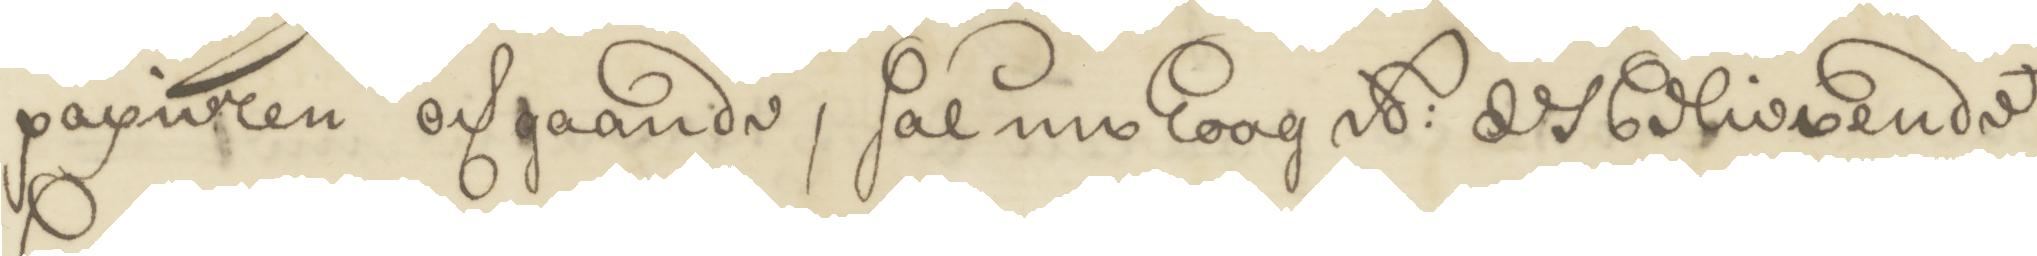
papieren overgaande, sal uw hoog Ed: des believende
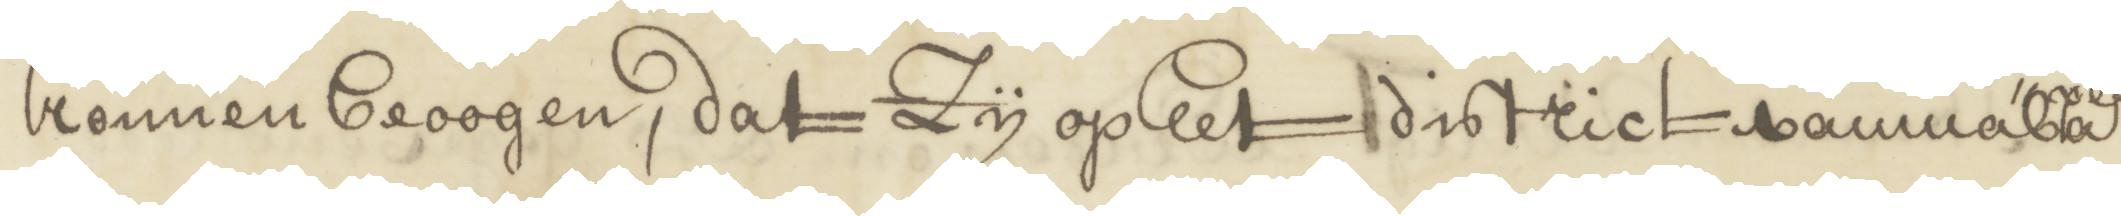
konnen beoogen, dat zij op het| district vanmaba
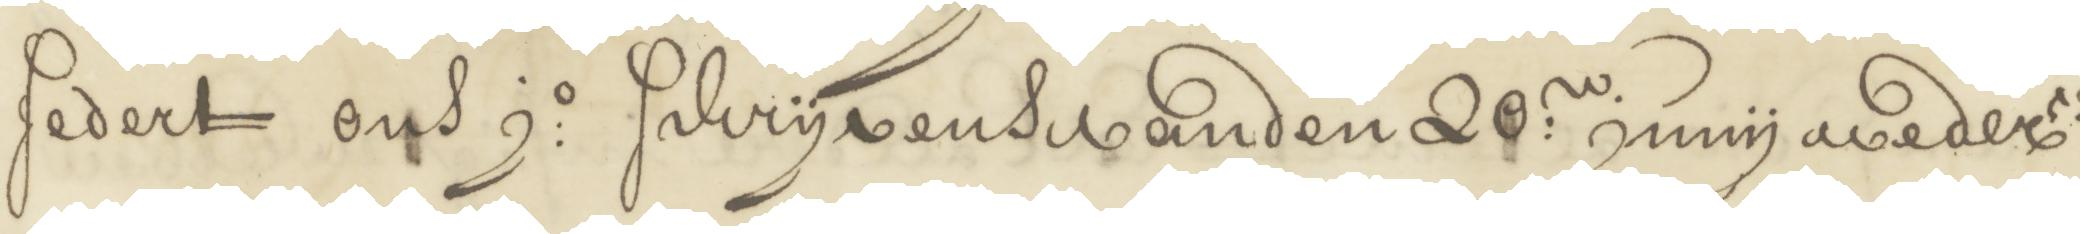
sedert ons j:o schrijvens van den 20:en junij weder
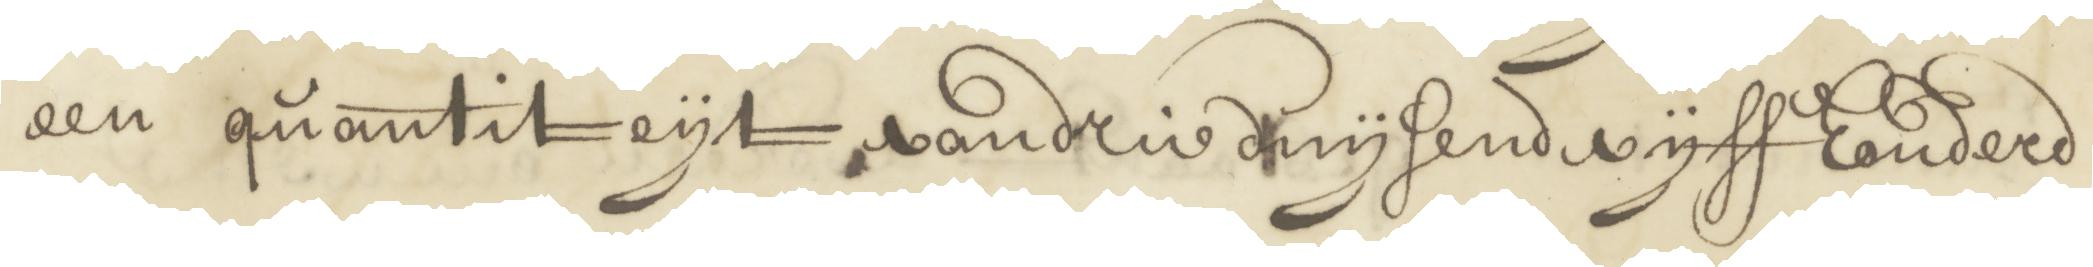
een quantiteijt, van drie duijsend vijff honderd
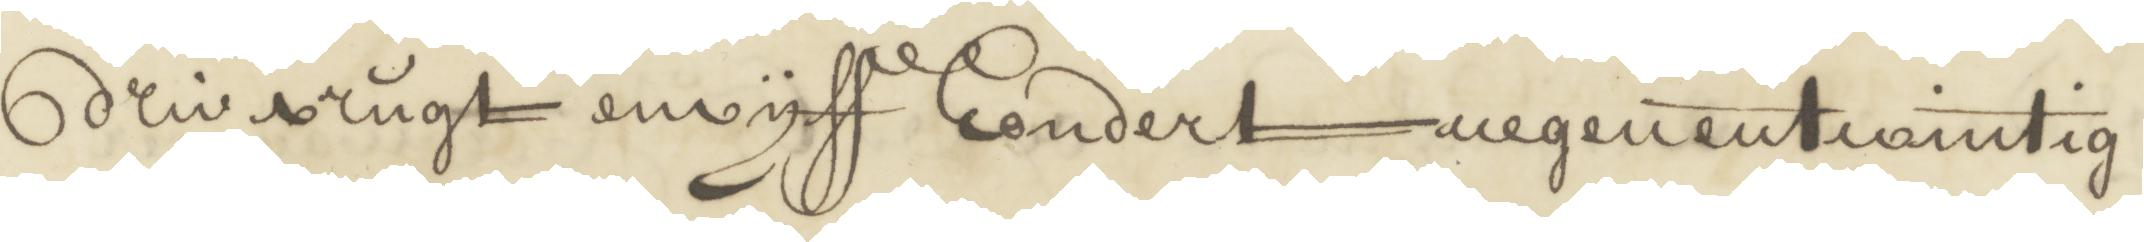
drie vrugt en vijff hondert negenentwintig
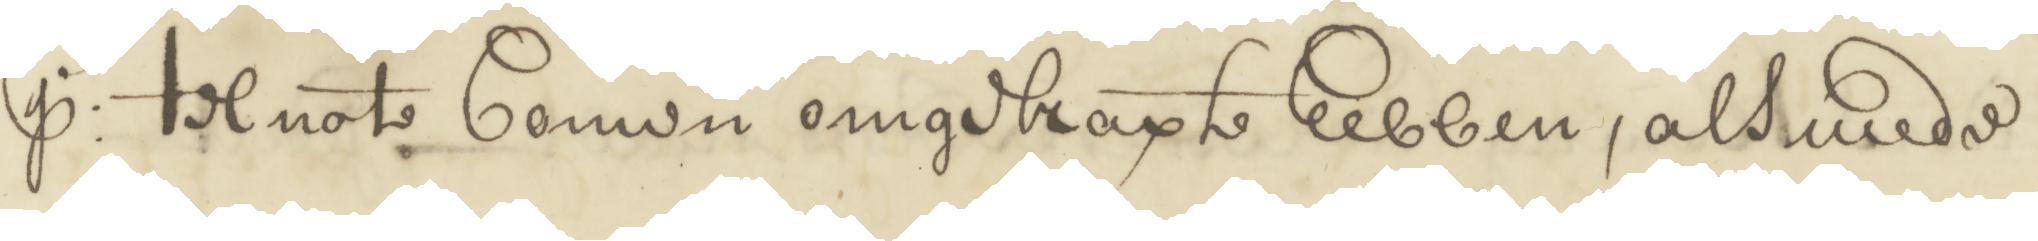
p:s tel note Comen omgekapte hebben, als mede
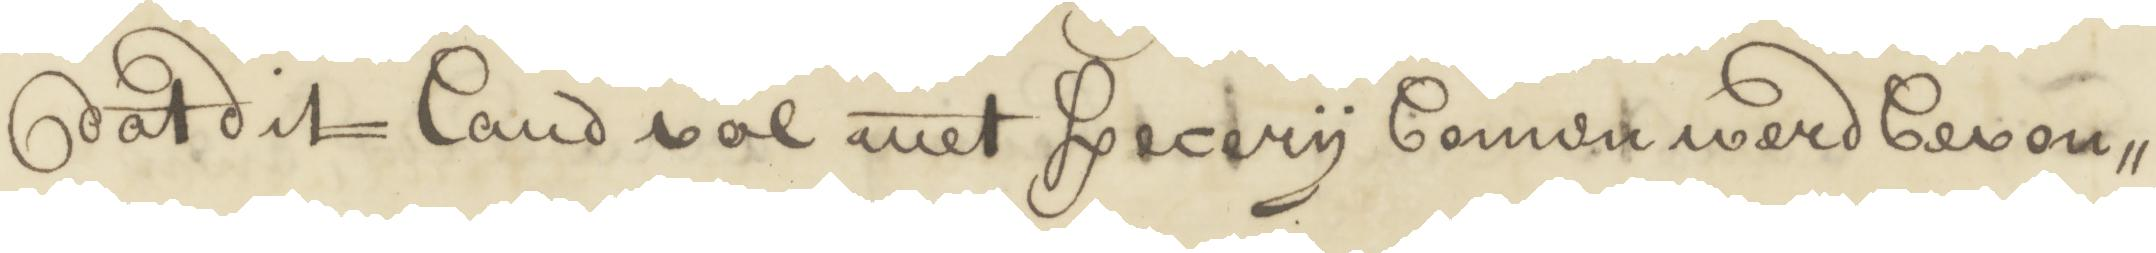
dat dit land vol met specerij bomen werd bevon„
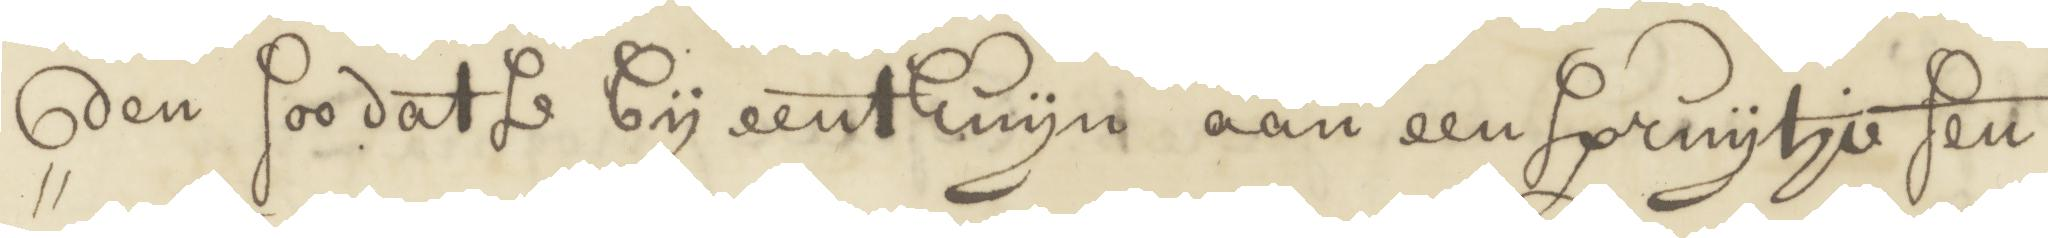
„den soo datse bij eenthuijn aan een spruijtje sen
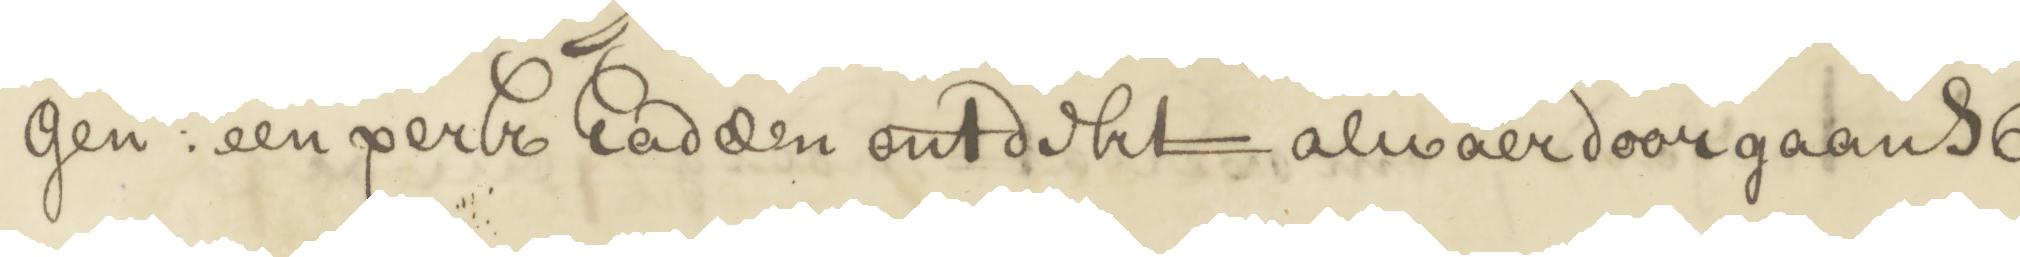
gen:t een perk hadden ontdekt, alwaer door gaans
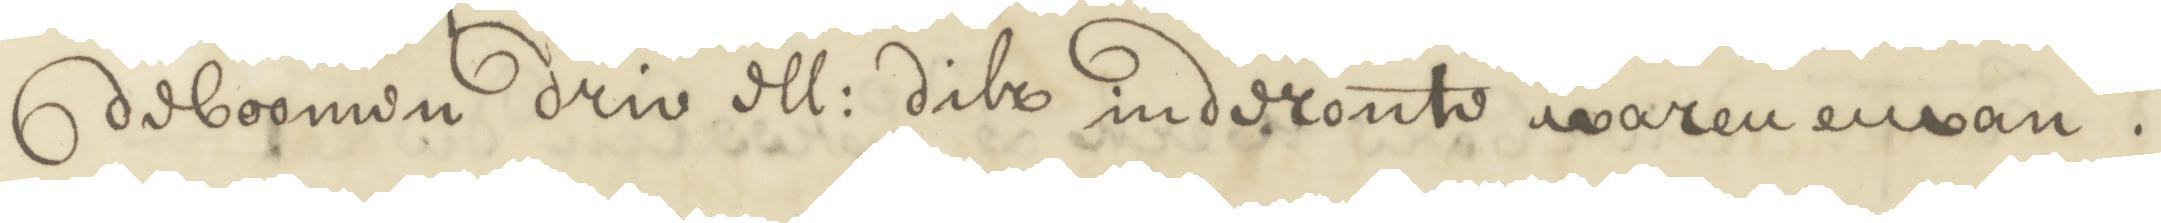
deboomen drie ell: dik in de ronte waren en van.
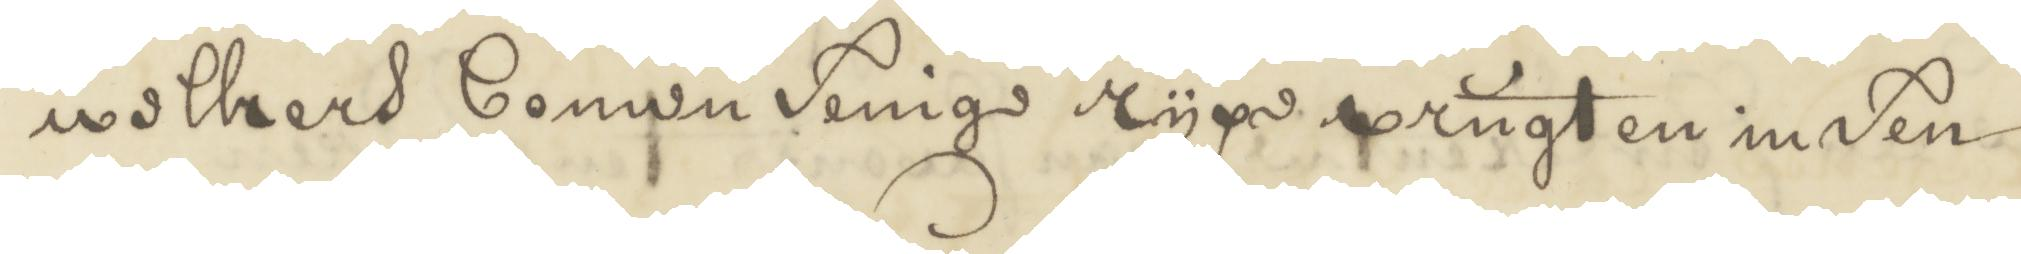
welkers bomen Eenige rijpe vrugten in Een
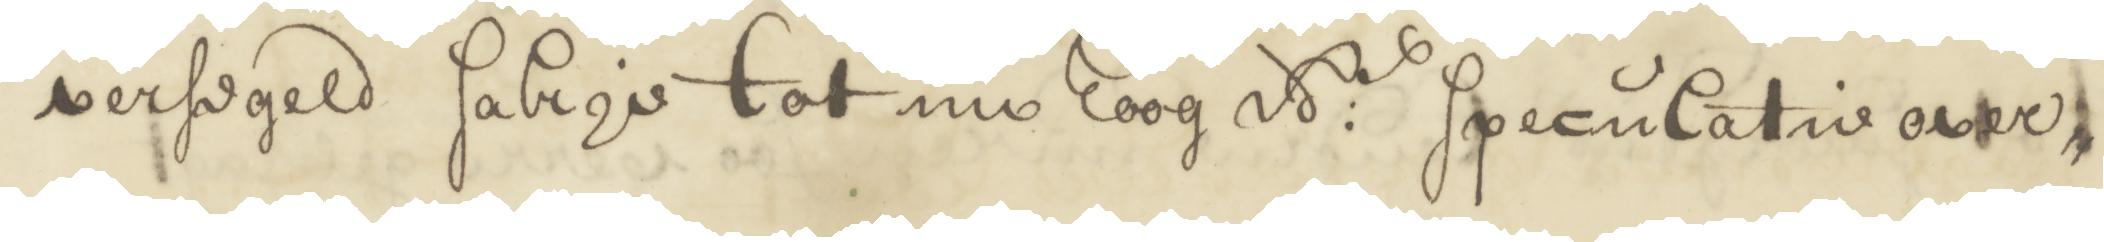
versegeld sakje tot uw hoog Ed:e speculatie over„
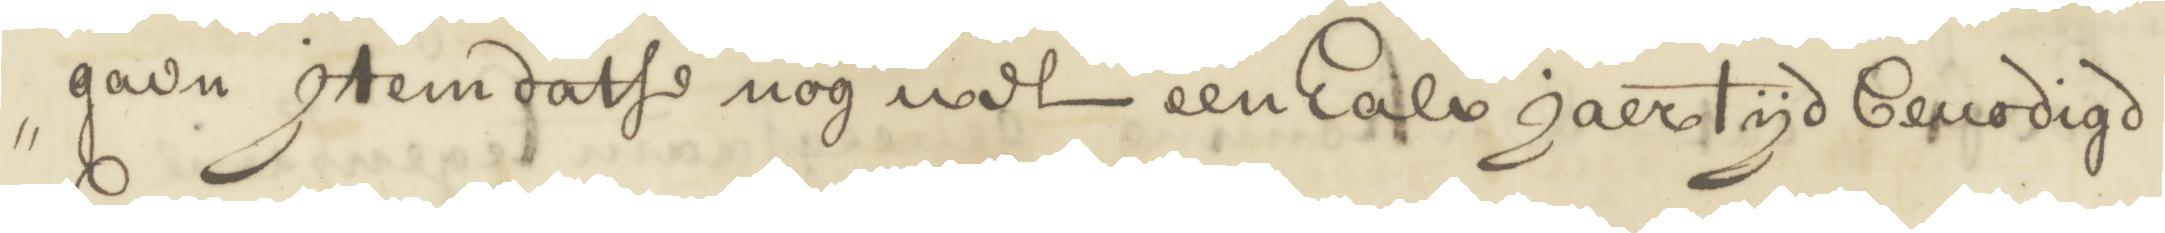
„gaen jtem datse nog wel een halv jaertijd benodigd
